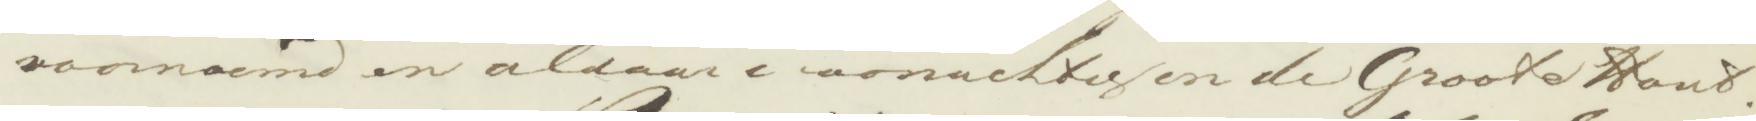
voornoemd en aldaar woonachtig in de Groote Hout
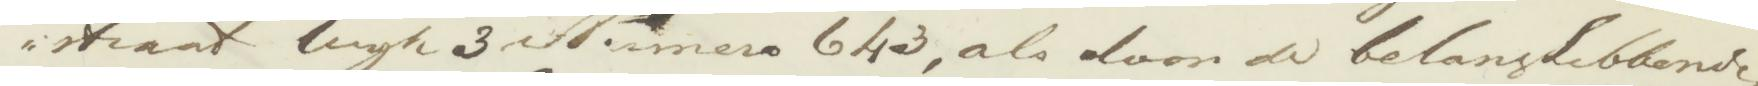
„straat wyk 3, Numero 643, als door de belang hebbenden
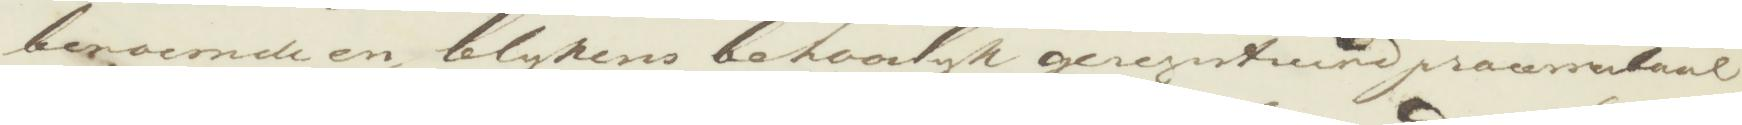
benoemde en blykens behoorlyk geregistreerd procesverbaal
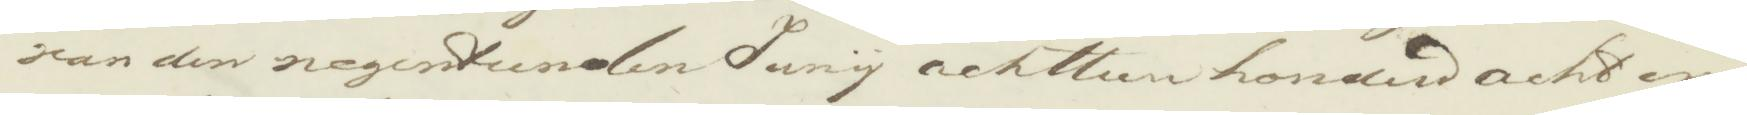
van den negentienden Iuny achttien honderd acht en
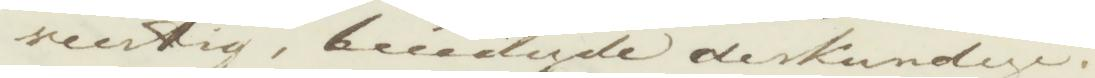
veertig, beëedigde deskundige
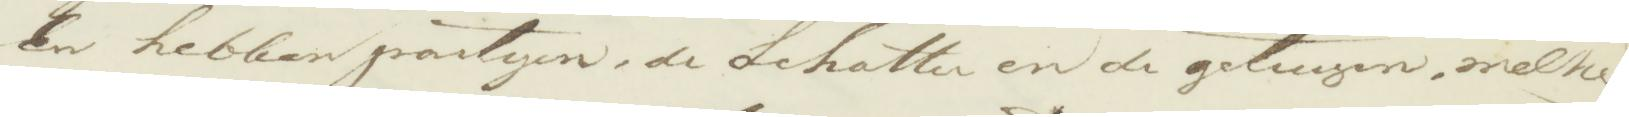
En hebben partyen, de schatter en de getuigen, welke
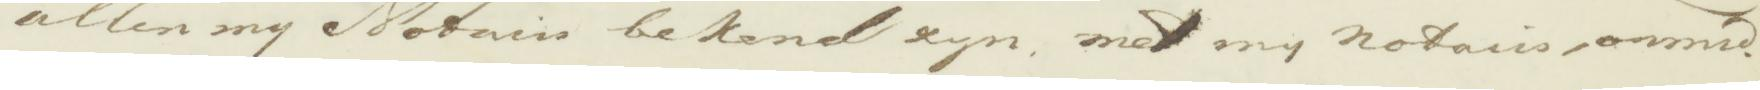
allen my Notaris bekend zyn, met my notaris, onmid.
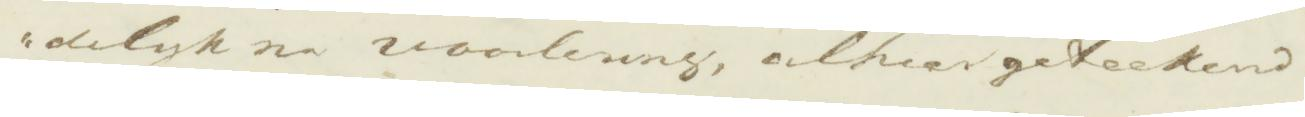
„delyk na voorlezing, alhier geteekend
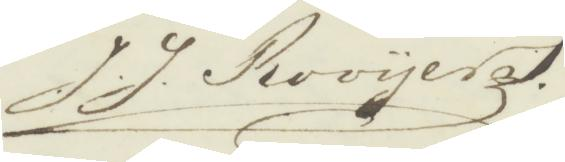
J.J. Rooijers.
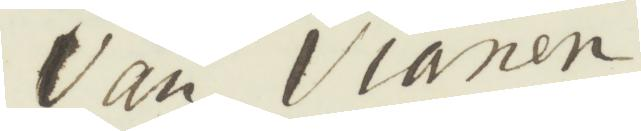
Van Vianen
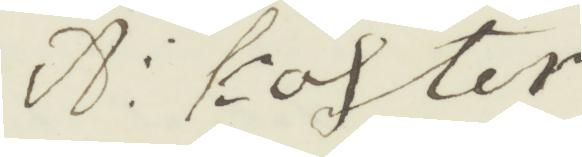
A: Koster
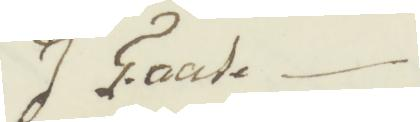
J Faas.
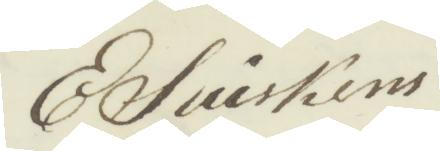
E Suiskens
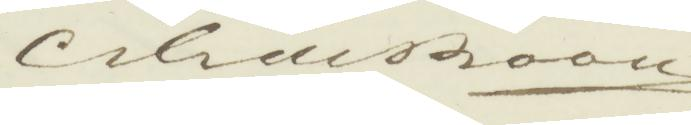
Chr de Boon
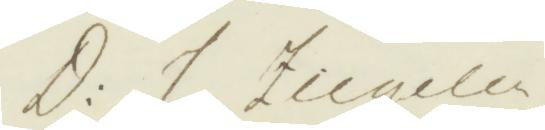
D: J. Ziegelen
